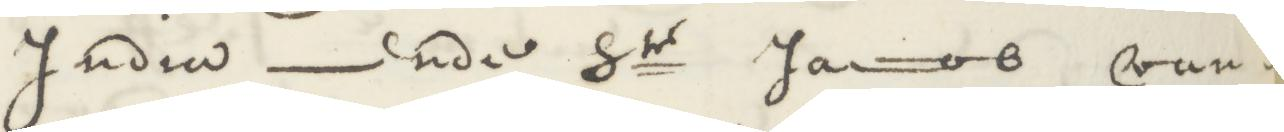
Jndia ende h=r Jacob van
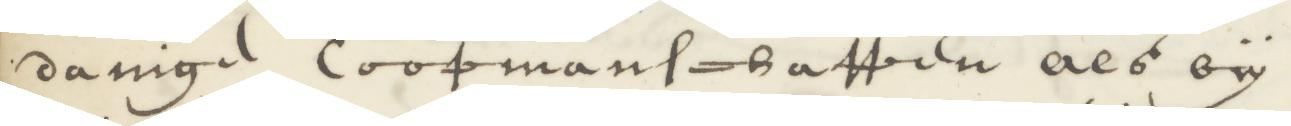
danige Coopmanschappen als bij
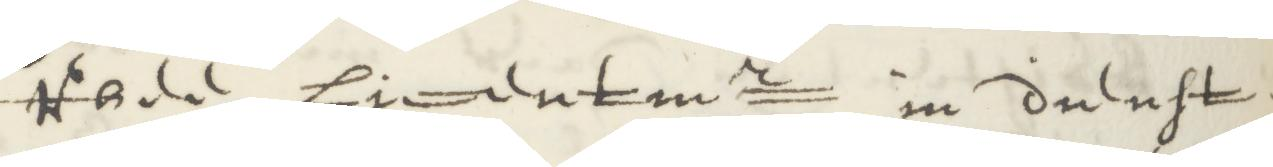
Rhee Licentm=r in dienst
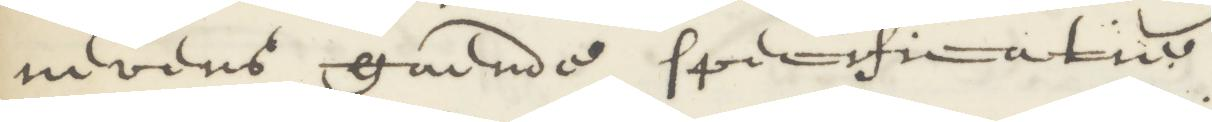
nevens gaende specificatie
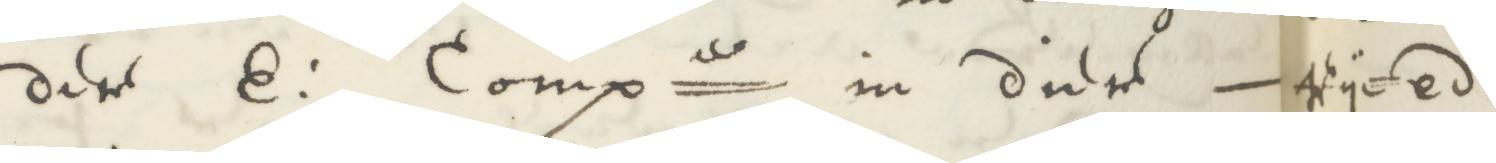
der E: Comp=e in dier -
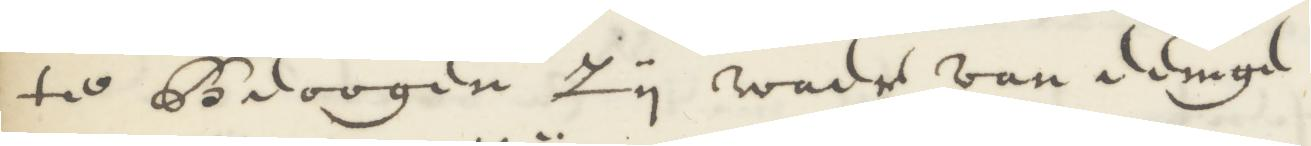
te Beoogen zij waer van eenige
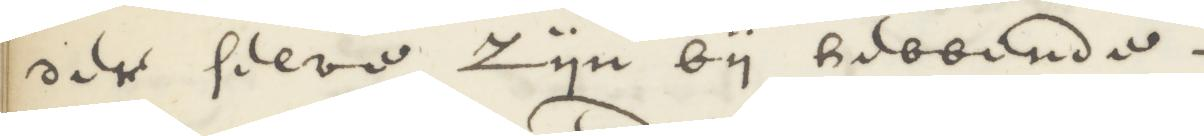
der selve zijn bij hebbende
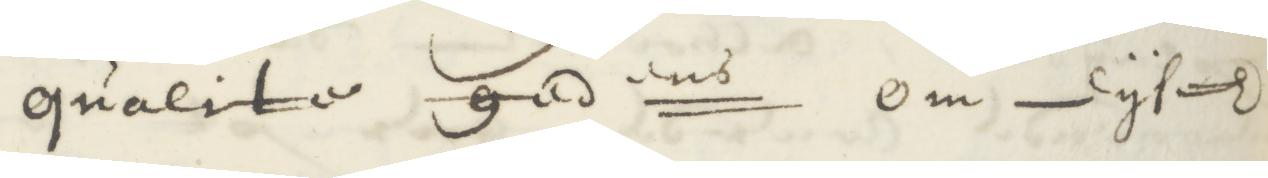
qualite ged=ens om eijsch
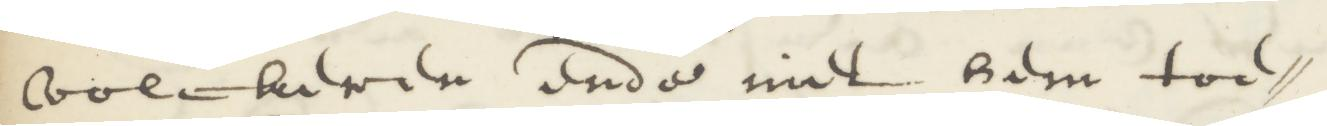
volckeren ende niet hem toe„
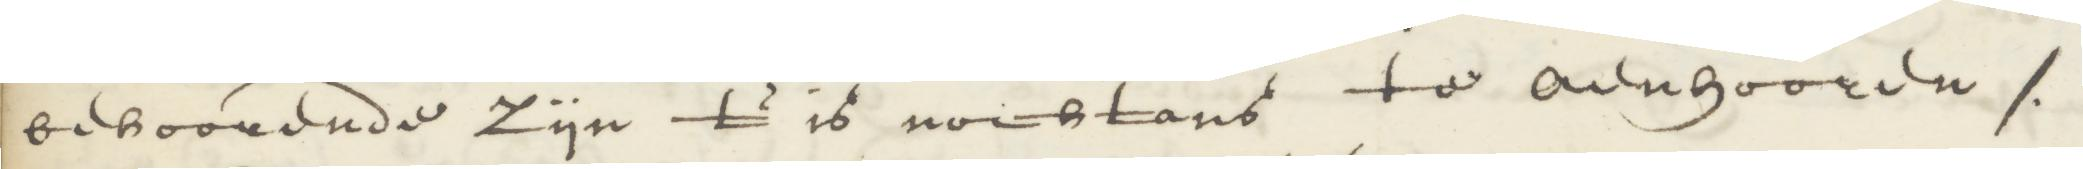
behoorende zijn t' is nochtans te aenhooren/.
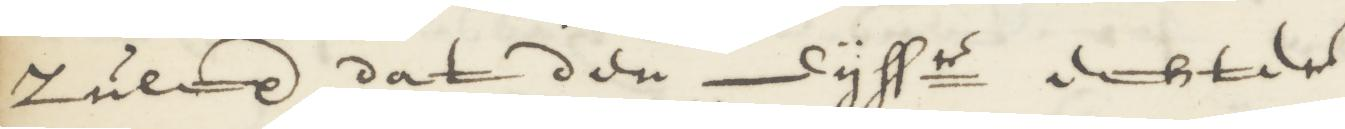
zulx dat den eijss=r echter
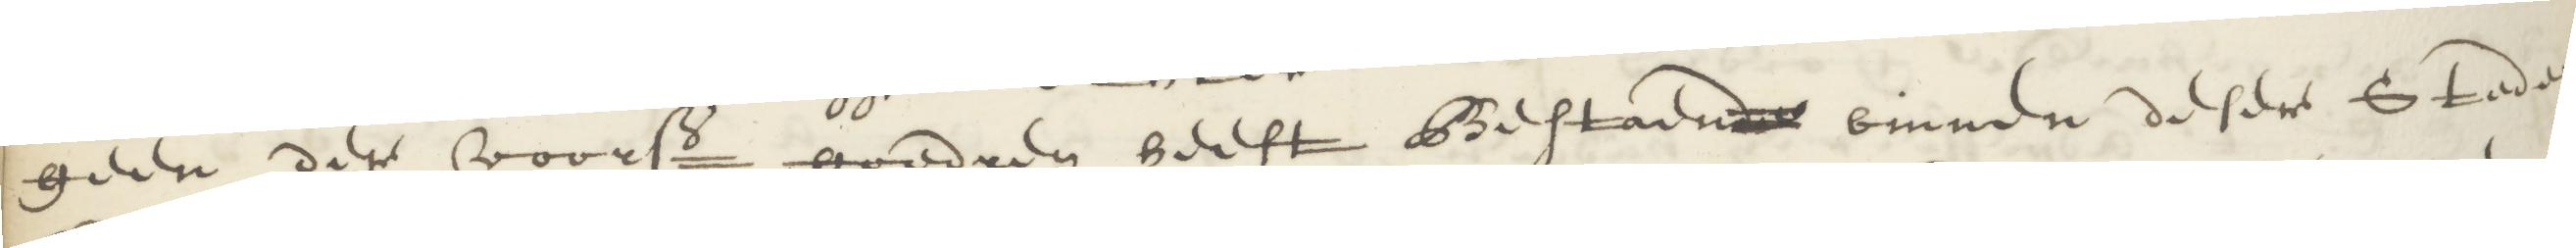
geen der voors=z goedren heeft Bestaende binnen deser stede
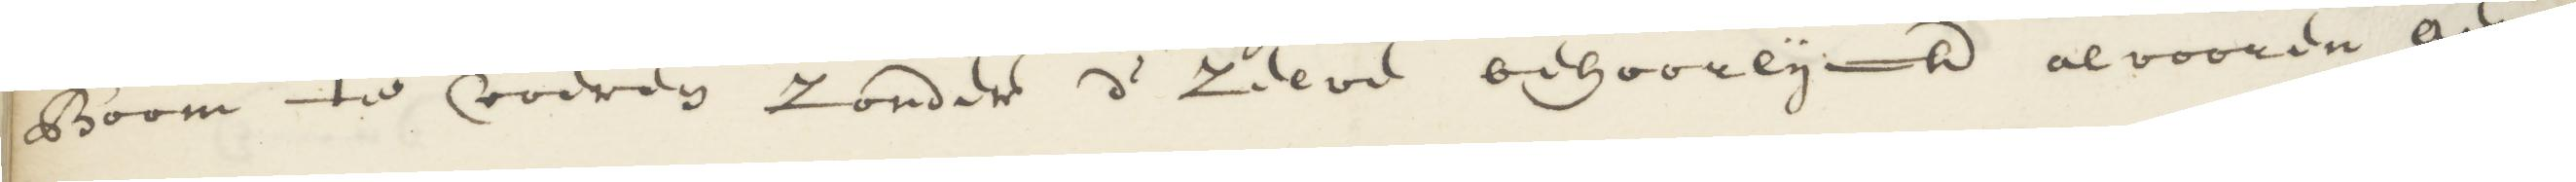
Boom te voeren zonder d’ zelve behoorlijck alvooren aen
